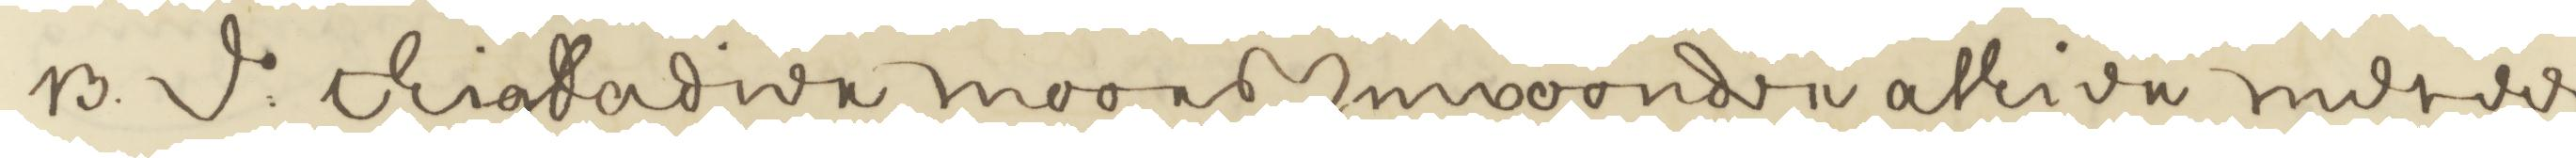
13. _:o Chiafadier moors jnwoonder alhier met een
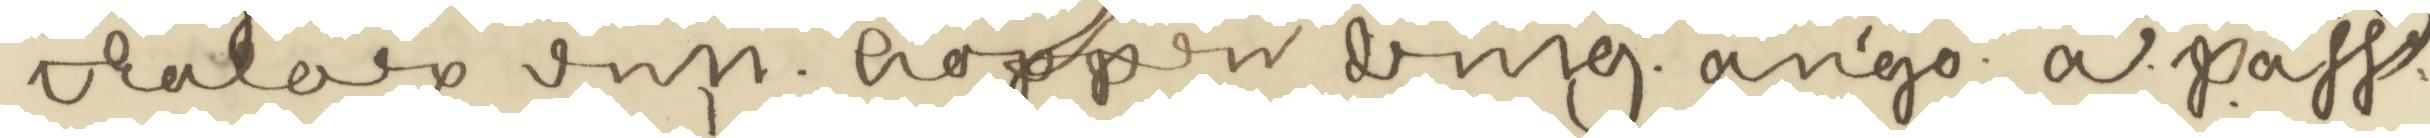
Chaloep en 11. koppen den 19. augo: a:o pass:o
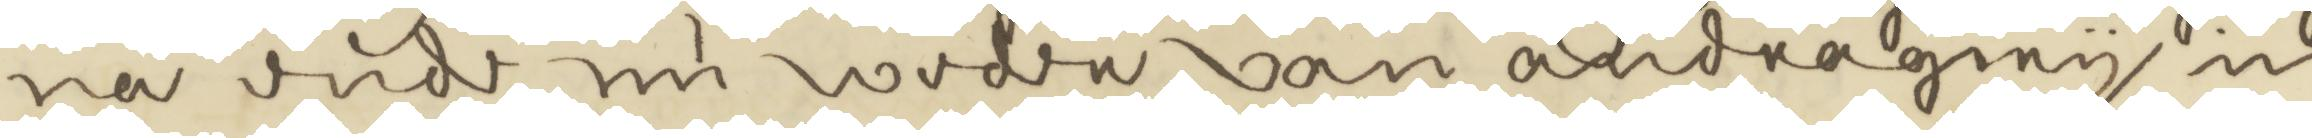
na ende nu weder van andragirij in
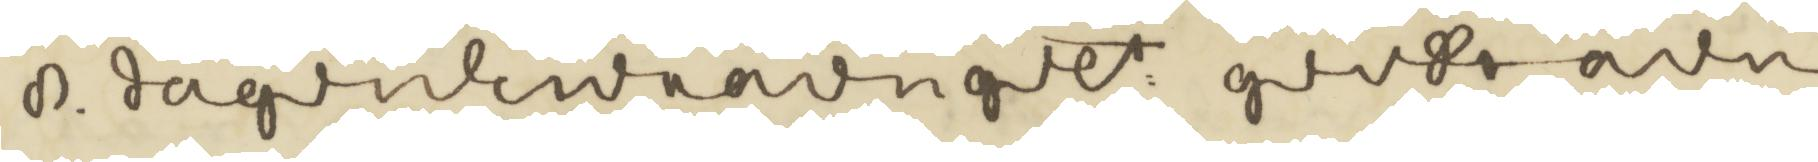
8. dagen hier aengel:t geeft aen
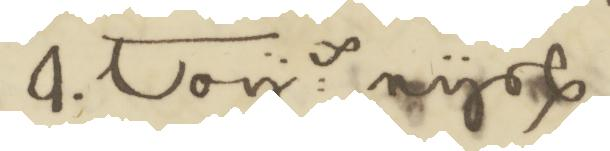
4. Coij:s rijst
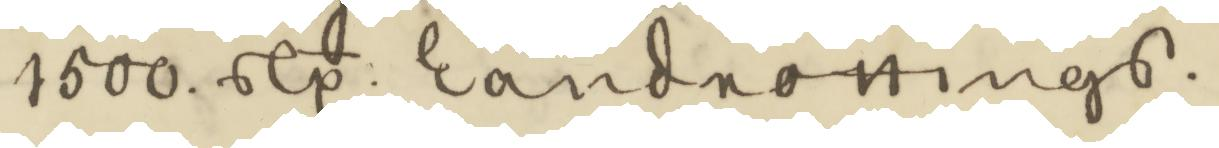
1500. stx: handrottings.
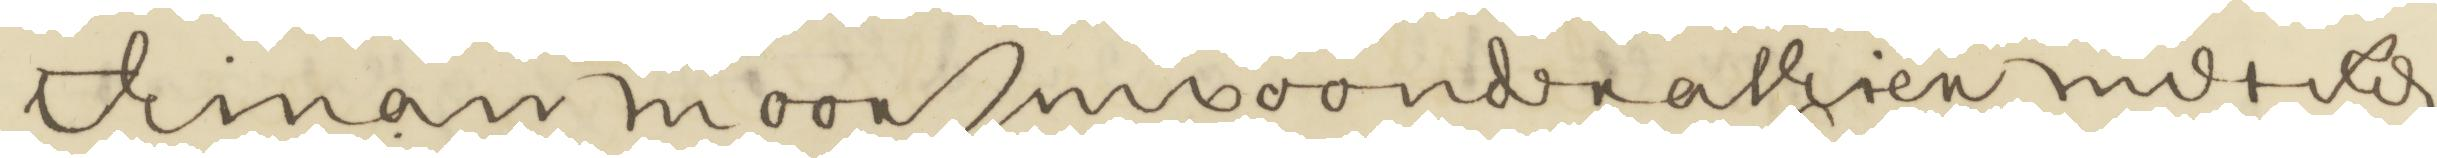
Chinan moor jnvoonder alhier met Een
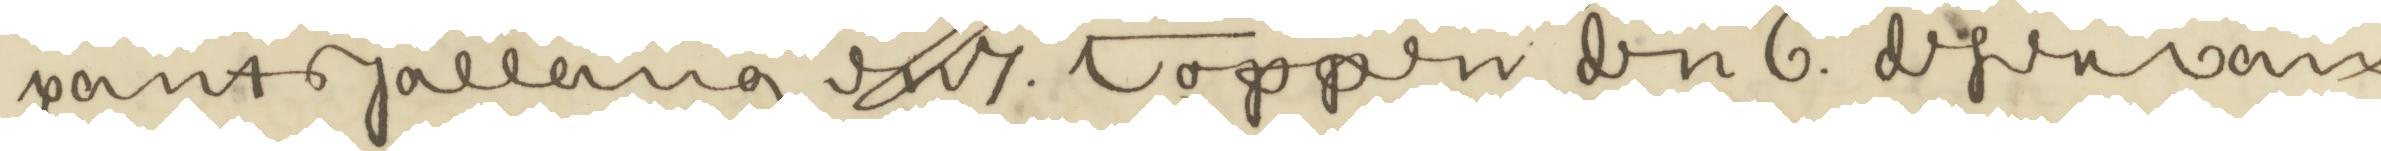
pantsjallang en 7. Coppen den 6. deser van
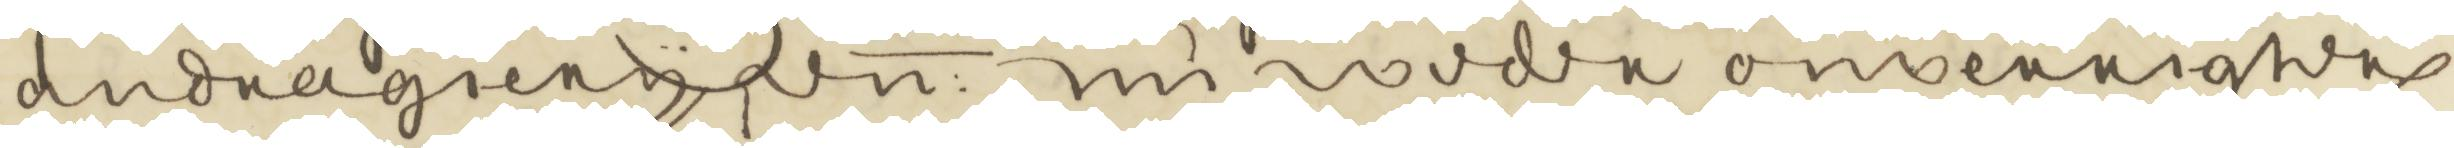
andragierij en: nu weder onverrigter
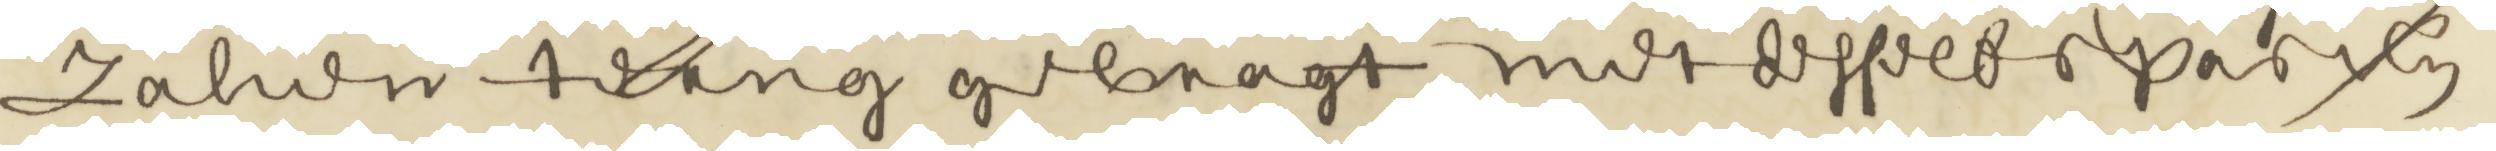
zaken terug gebragt met desselfs pas En
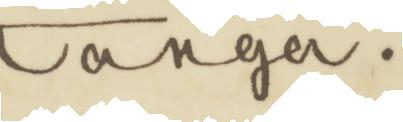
Carga.
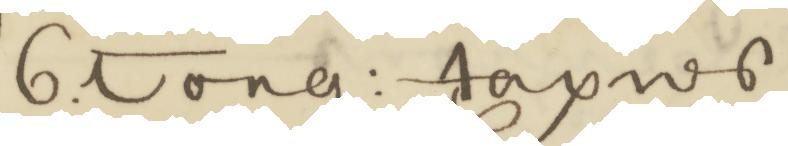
6. Corg: tapies
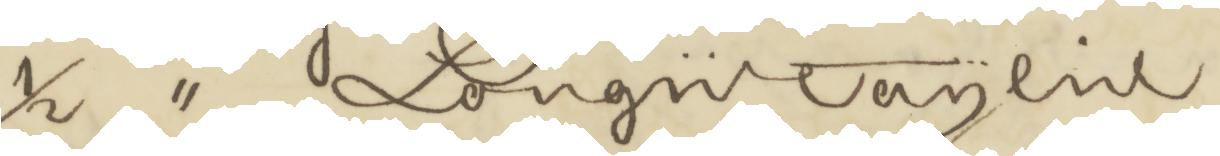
½ „ longie Caijlie
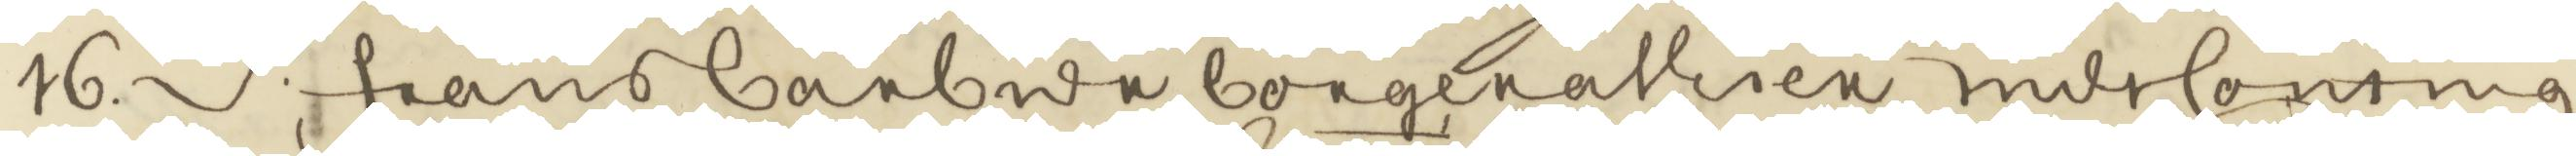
16. _:o Frans barbier borger alhier met Conting
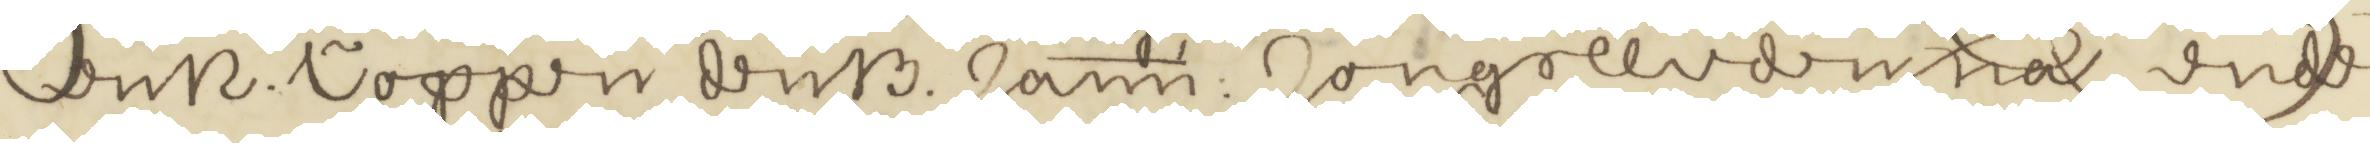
en 12. Coppen den 13. janu: jongstleden na ende
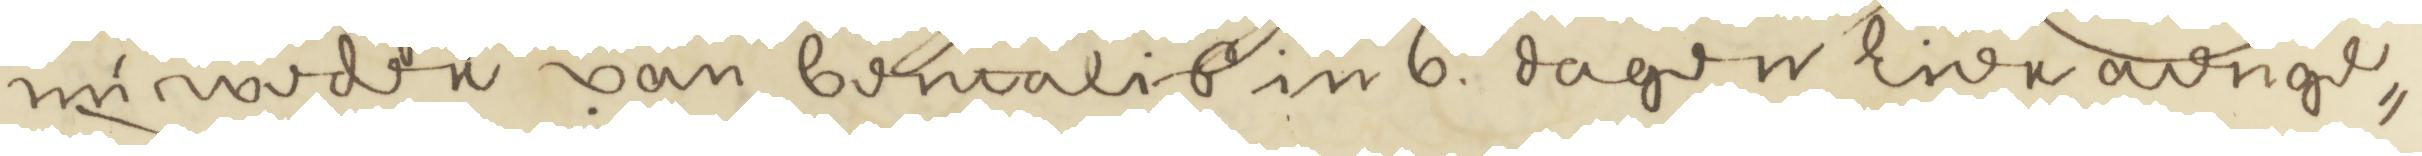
nu weder van bencalis in 6. dagen hier aenge„
